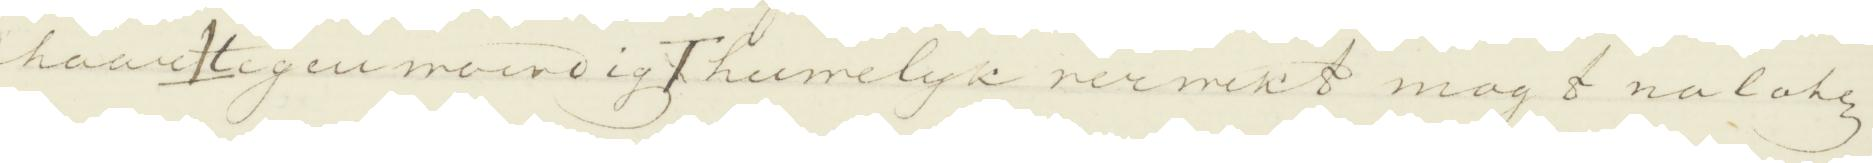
haar ¶ tegenwoordigh huwelyk verwekt mogt na laten
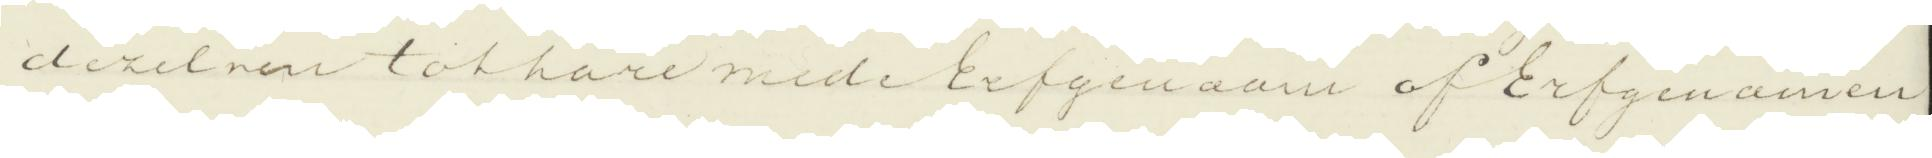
dezelven tot hare mede Erfgenaam of Erfgenamen
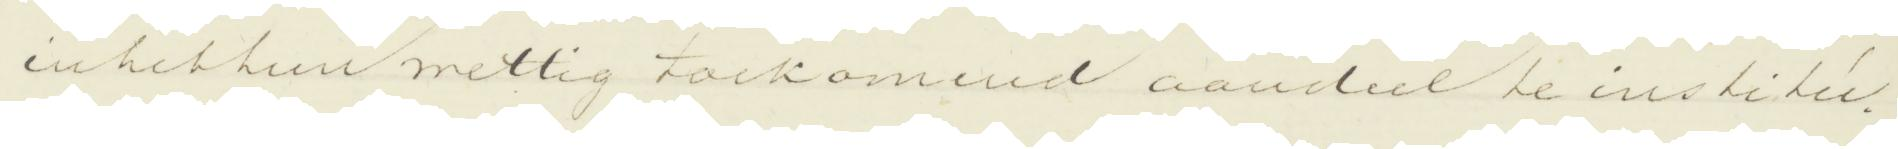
in het hun wettig toekomend aandeel te institu„
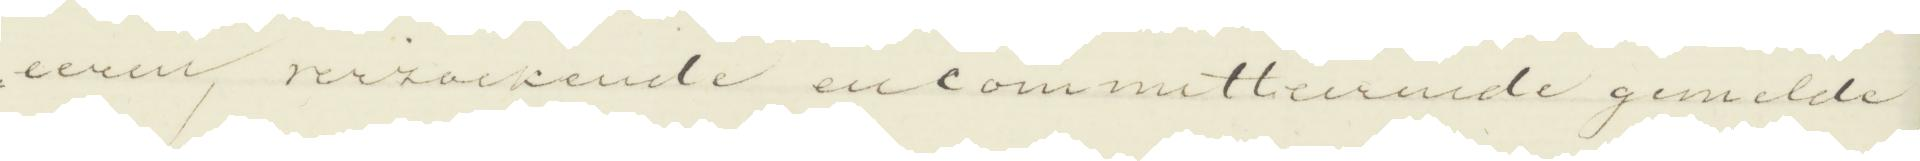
eeren, verzoekende en committeerende gemelde
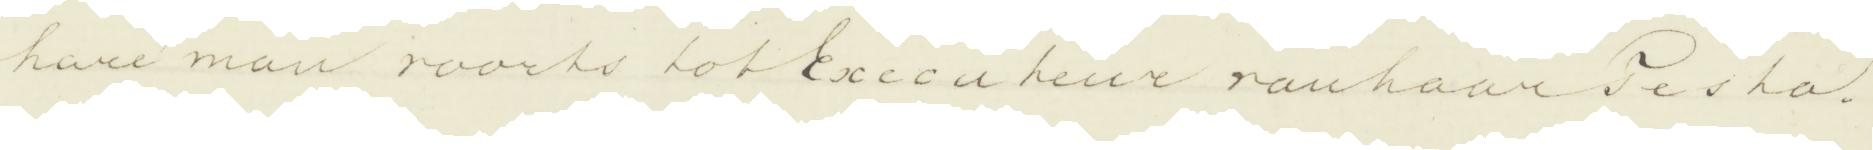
hare man voorts tot Executeur van haar Testa„
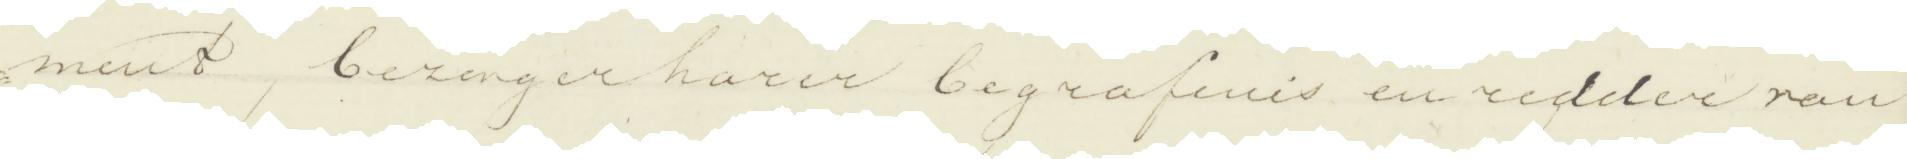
ment, bezonger harer begrafenis en redder van
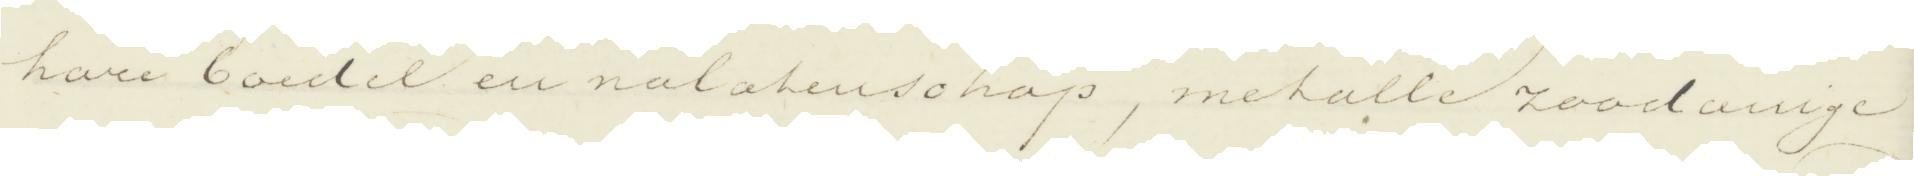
hare boedel en nalatenschap, met alle zoodanige
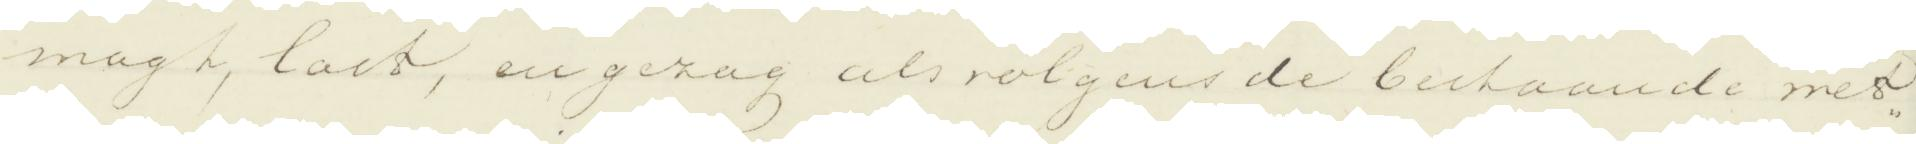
magt, last, en gezag als volgens de bestaande wet„
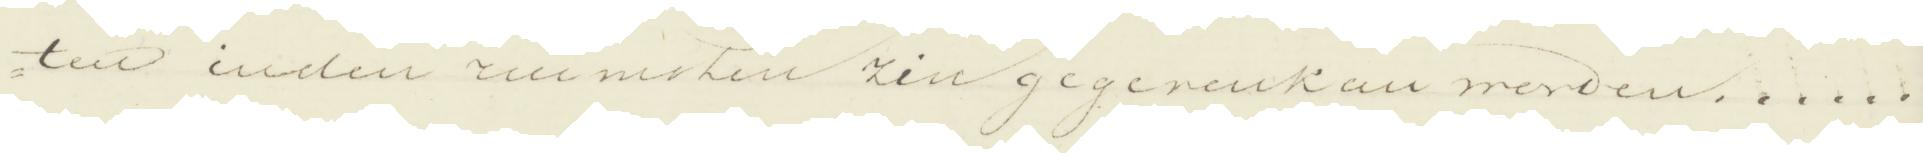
=ten inden ruimsten zin gegeven kan werden . . . . . .
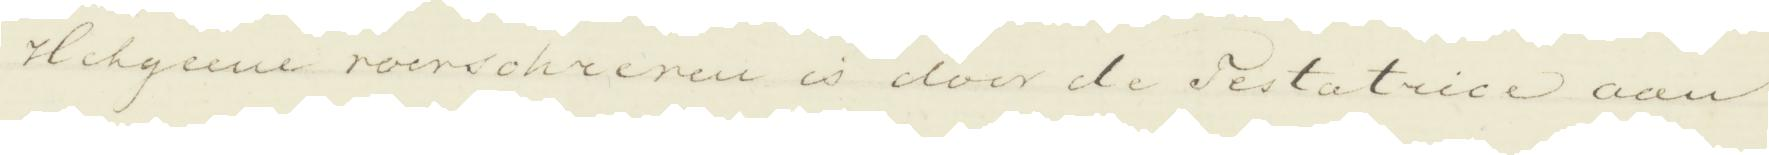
Hetgeene voorschreven is door de Testatrice aan
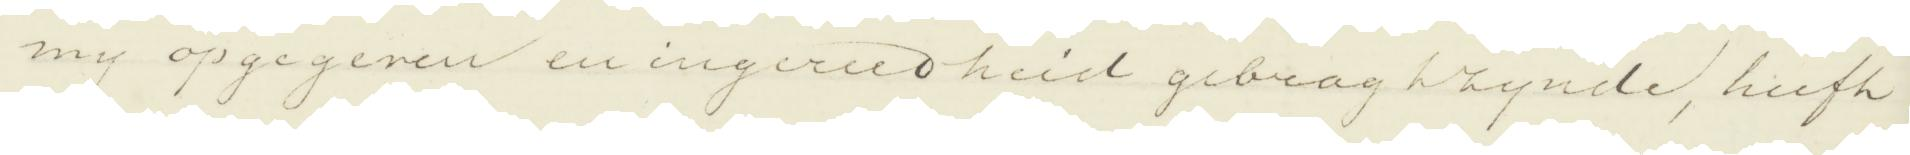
my opgegeven en ingereedheid gebragt zynde, heeft
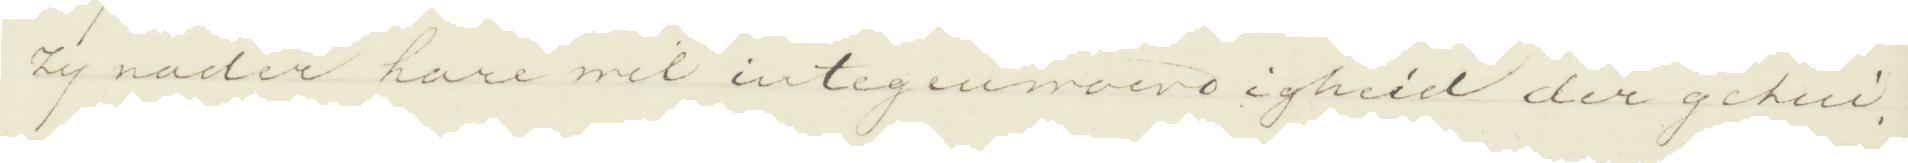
zy nader hare wel integenwoordigheid der getui„
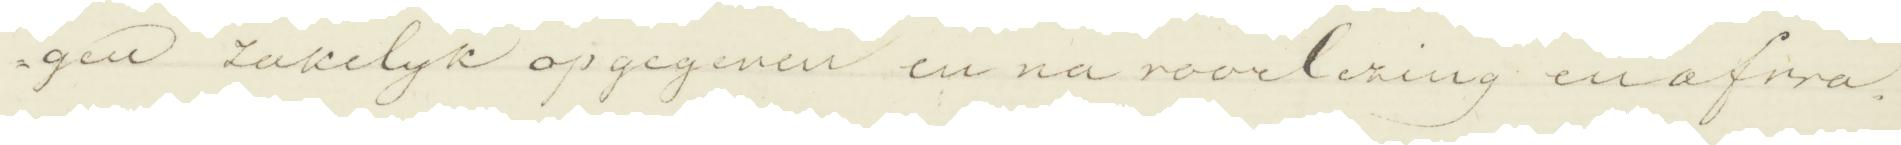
=gen zakelyk opgegeven en na voorlezing en afvra„
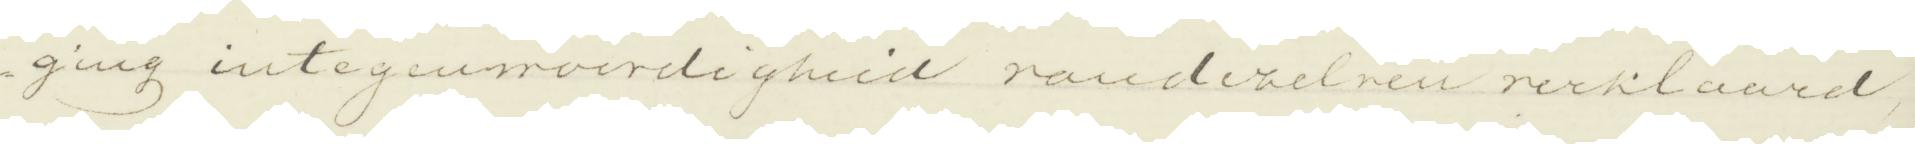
=ging integenwoordigheid van dezelven verklaard,
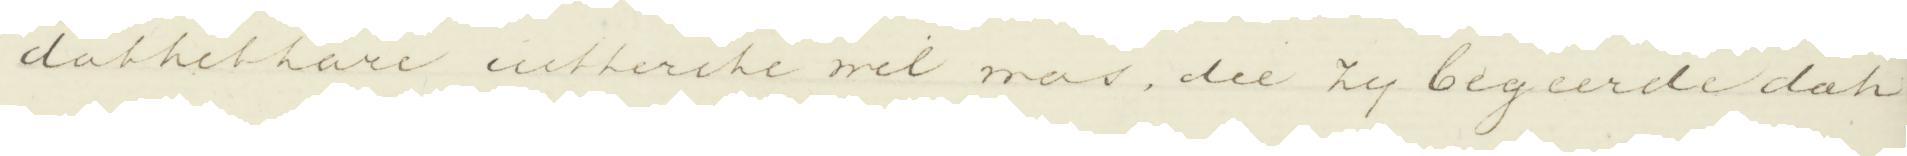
dat het hare uitterste wil was, die zy begeerde dat
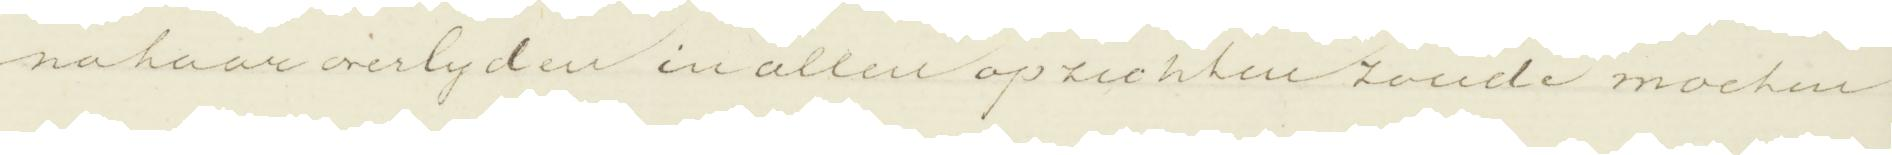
na haar overlyden in allen opzichten zoude moeten
